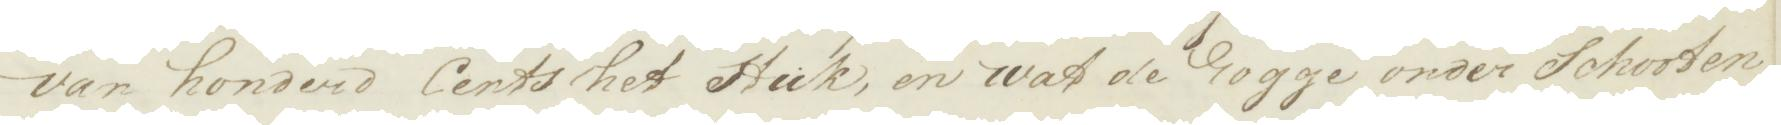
van honderd Cents het stuk, en wat de rogge onder schooten
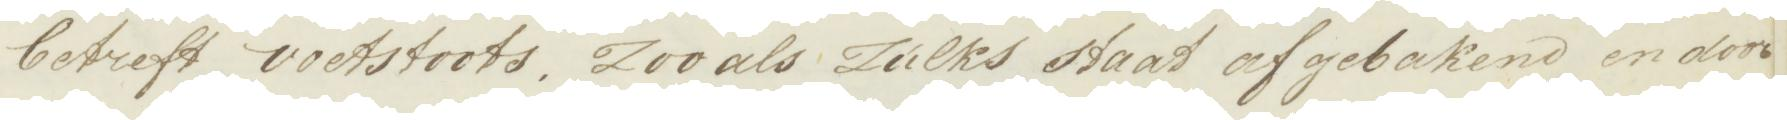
betreft voetstoots, zoo als zulks staat afgebakend en door
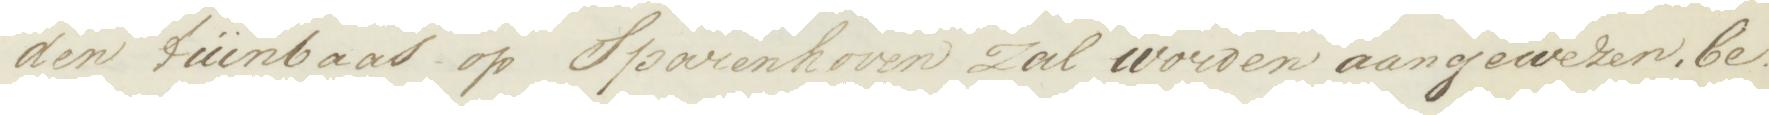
den tuinbaas op sparenhoven zal worden aangewezen, be
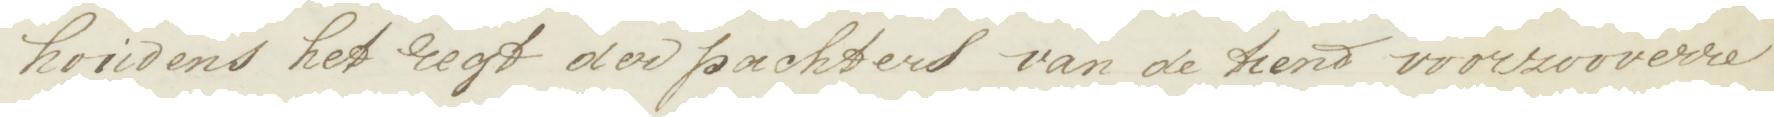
houdens het regt der pachters van de tiend voorzooverre
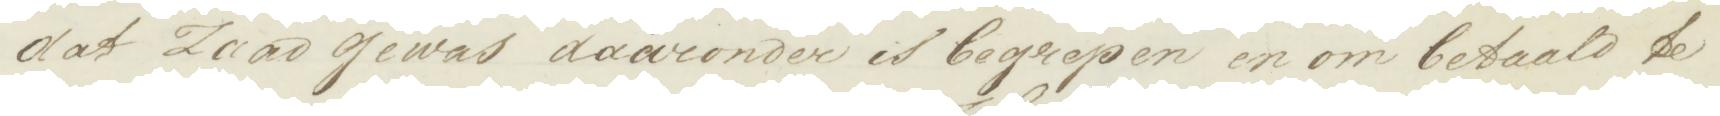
dat Zaad gewas daaronder is begrepen en om betaald te
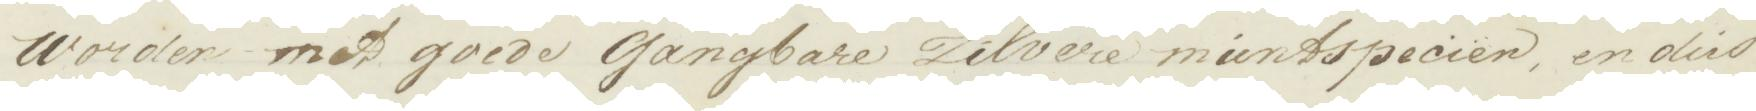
worden met goede Gangbare zilvere muntspeciën, en dus
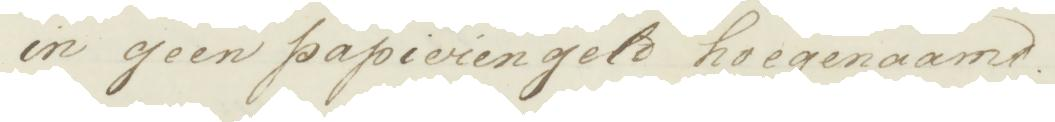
in geen papieren geld hoegenaamd.
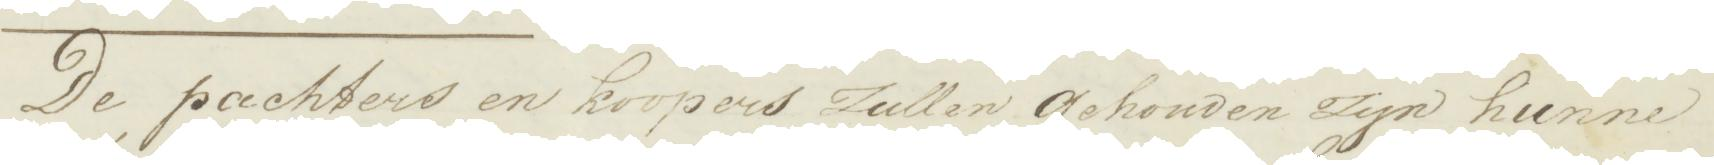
De pachters en koopers zullen gehouden zyn hunne
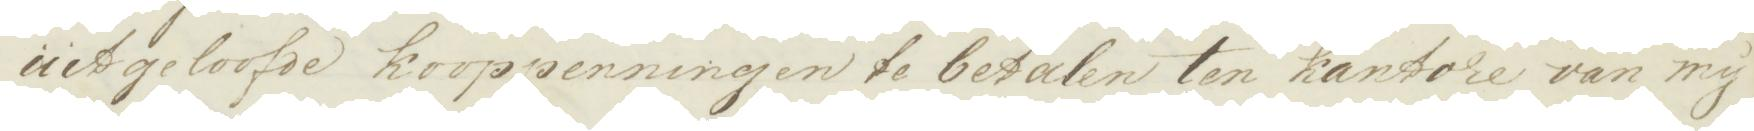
uitgeloofde kooppenningen te betalen ten kantore van mij
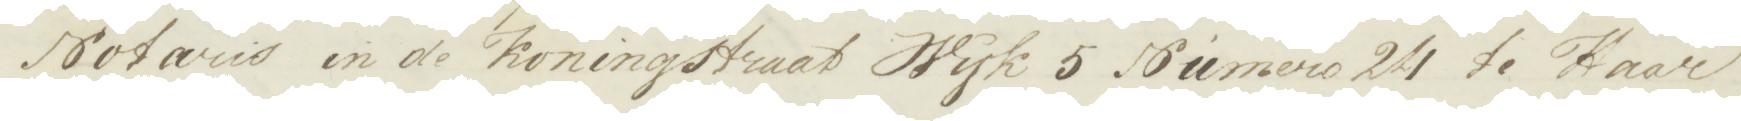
Notaris in de Koningstraat Wijk 5 Numero 24 te Haar
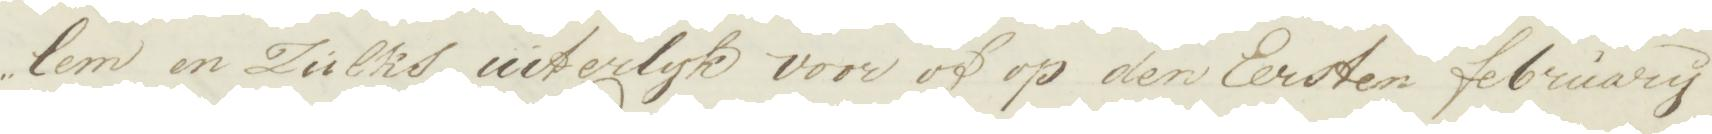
„lem en zulks uiterlyk voor of op den Eersten februarij
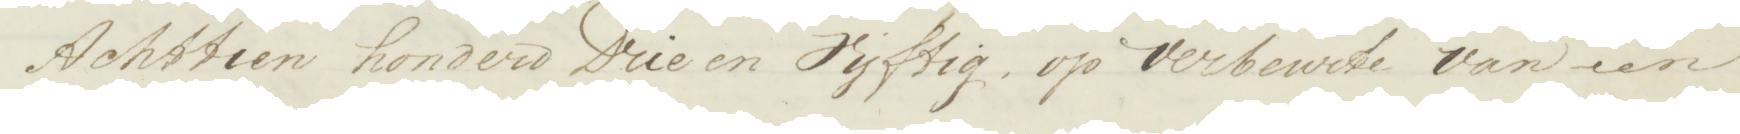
Achttien honderd Drie en Vijftig, op verbeurte van een
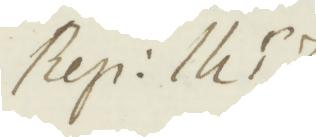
Rep: 1457
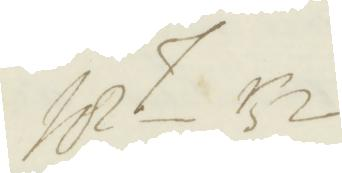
18 7/22 32
